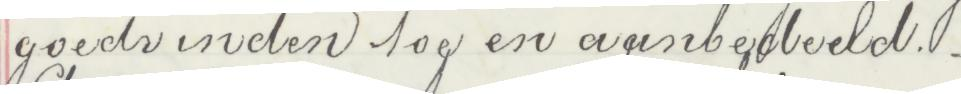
goedvinden toe en aanbedeeld.
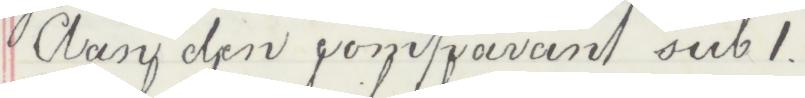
Aan den comparant sub 1.
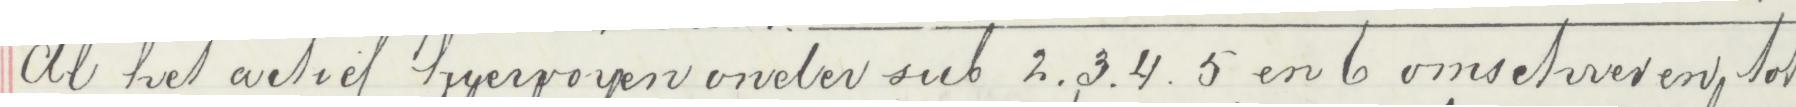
al het actief hiervoren onder sub 2. 3. 4. 5 en 6 omschreven, tot
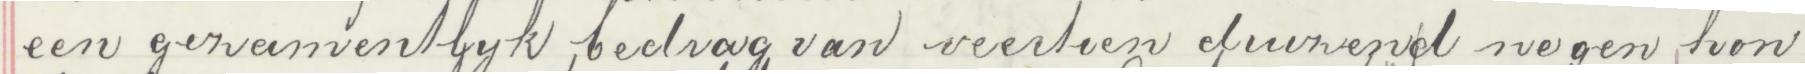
een gezamentlyk bedrag van veertien duizend negen hon
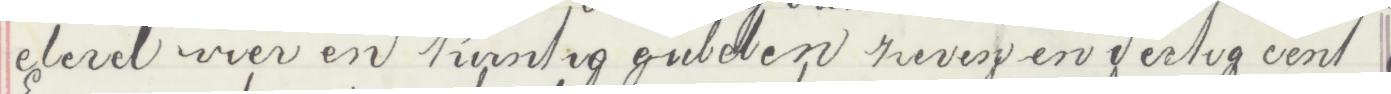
derd vier en twintig gulden zeven en dertig cent
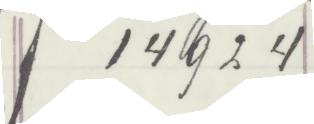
ƒ 14924
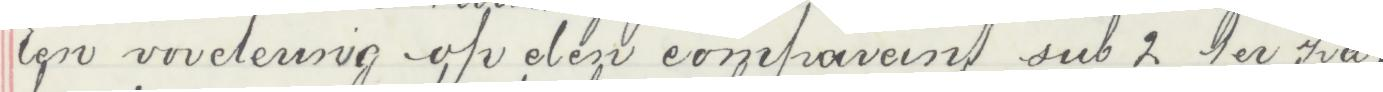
Een vordering op den comparant sub 2 ter za
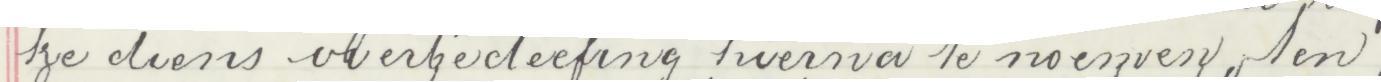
ke diens overbedeeling hierna te noemen en
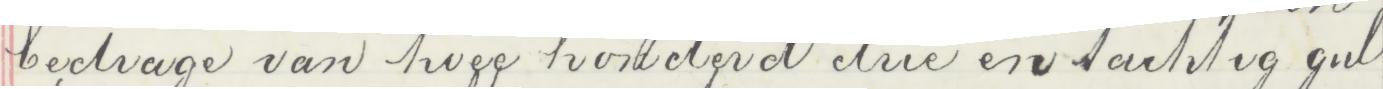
bedrage van twee honderd drie en tachtig gul
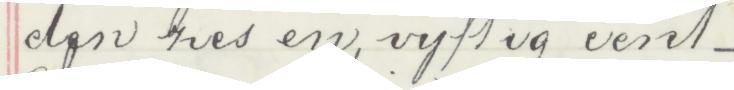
den zes en vyftig cent
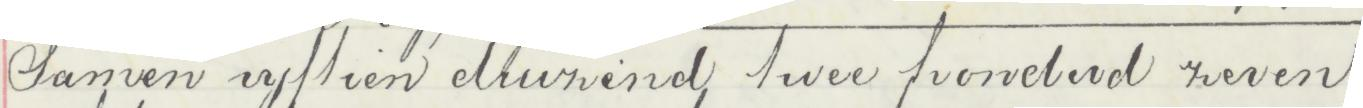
Samen vyftien duizend twee honderd zeven
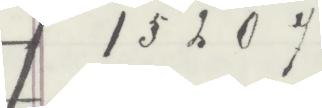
ƒ 15207
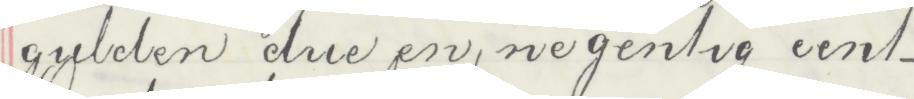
gulden drie en negentig cent
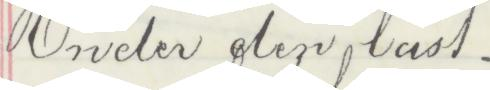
Onder den last
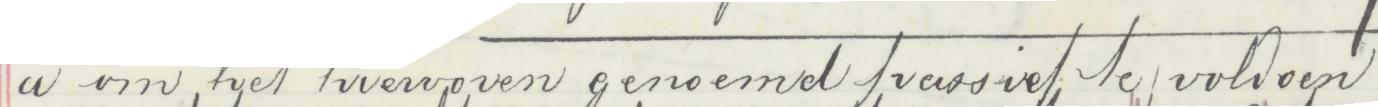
a om het hiervoren genoemd passief te voldoen
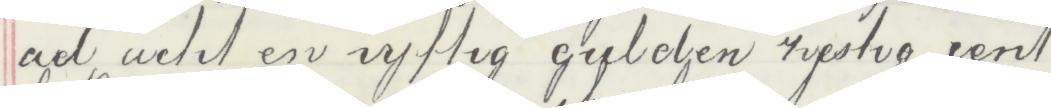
ad acht en vyftig gulden zestig cent
